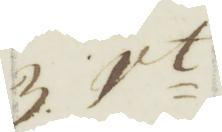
3. v=t
